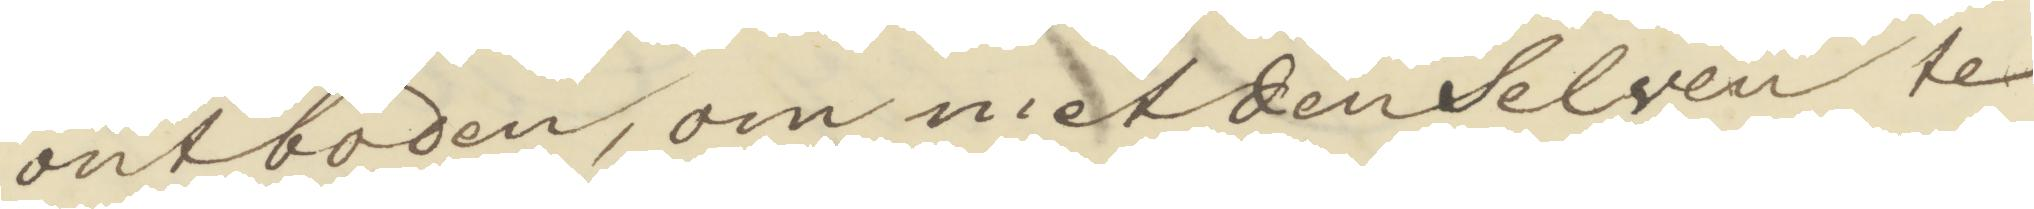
ontboden, om met denselven te
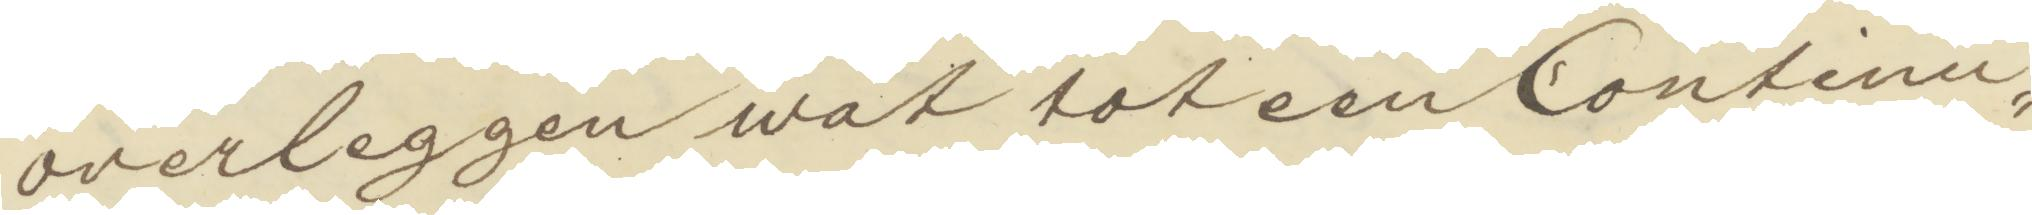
overleggen wat tot een Continu
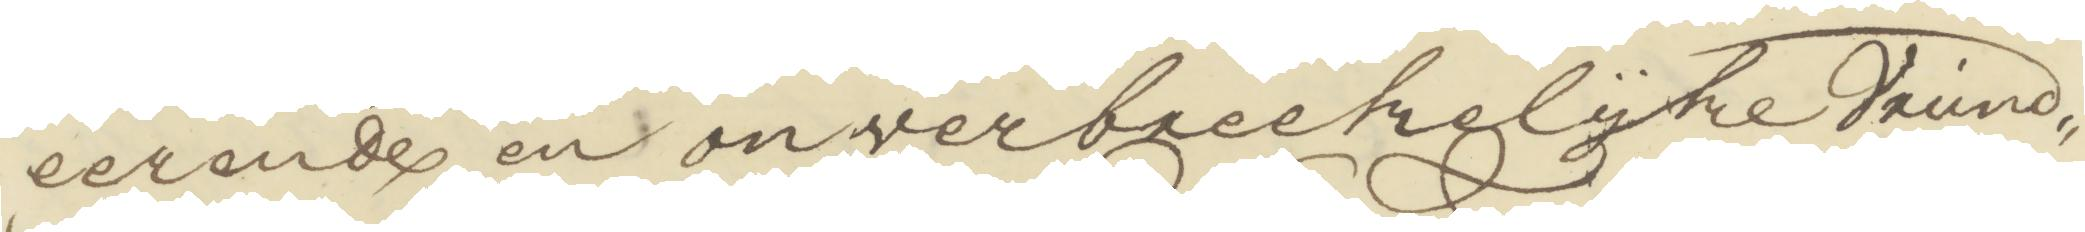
eerende en onverbreekelijke vrund„
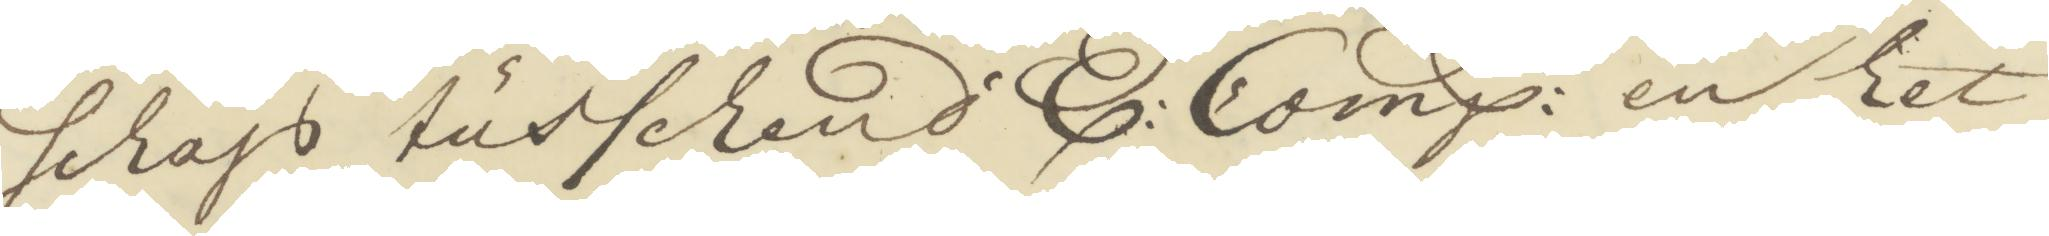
schap tusschen d' E: Comp: en het
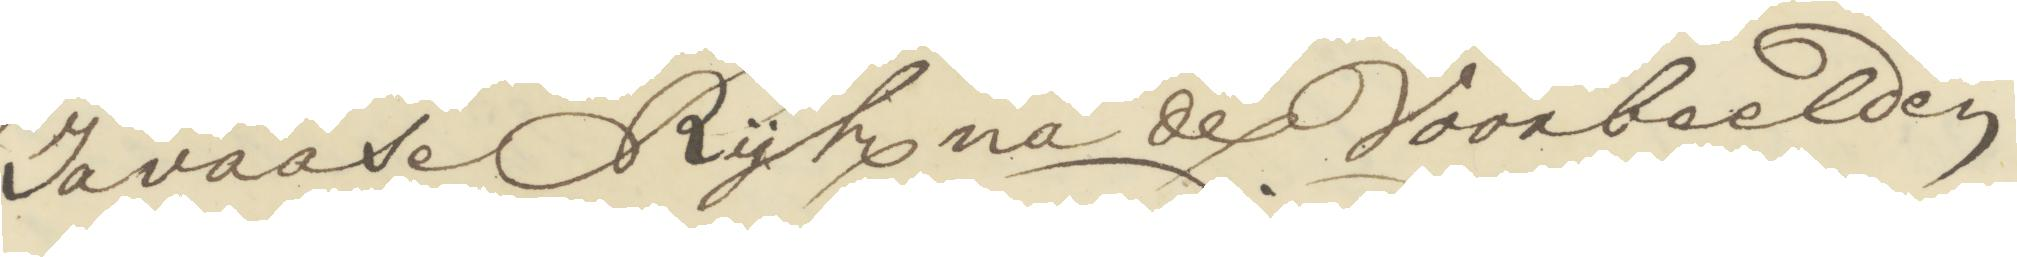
Iavaase Rijk na de Voorbeelden
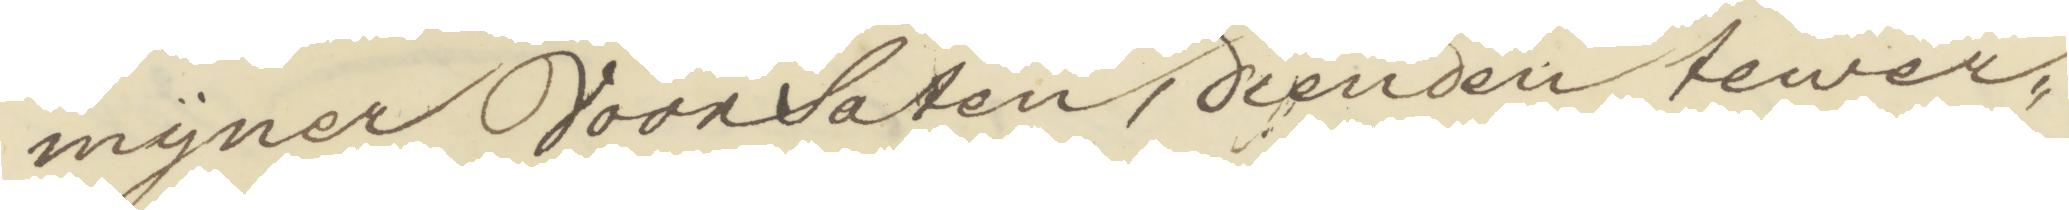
mijner Voorsaten, dienden tewer„
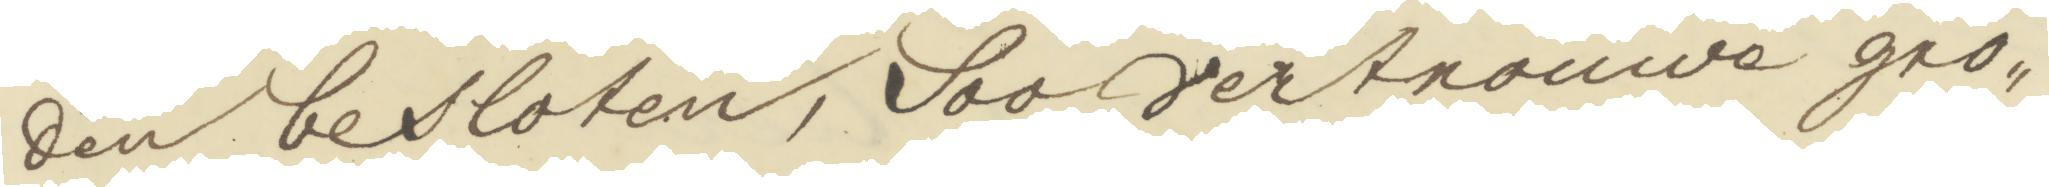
den besloten, soo vertrouwe gro„
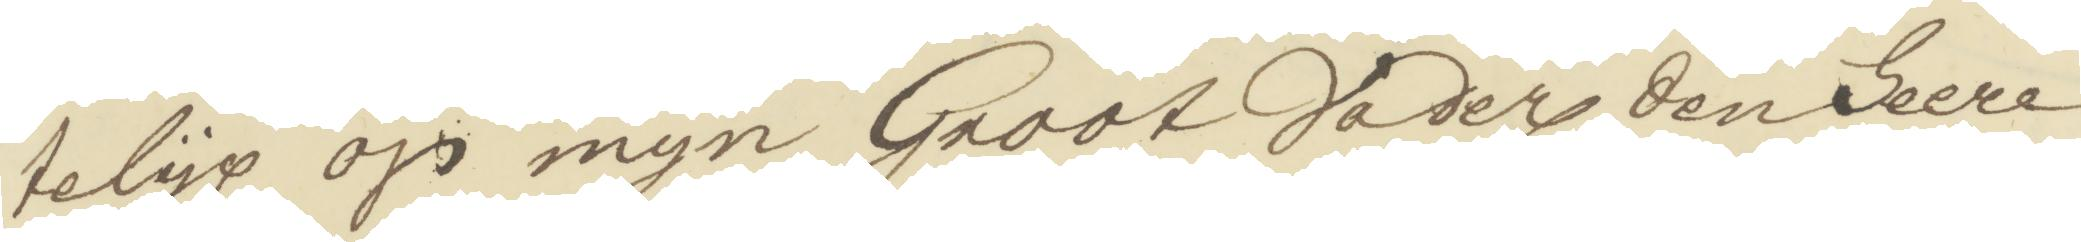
telijx op mijn Groot Vader den heere
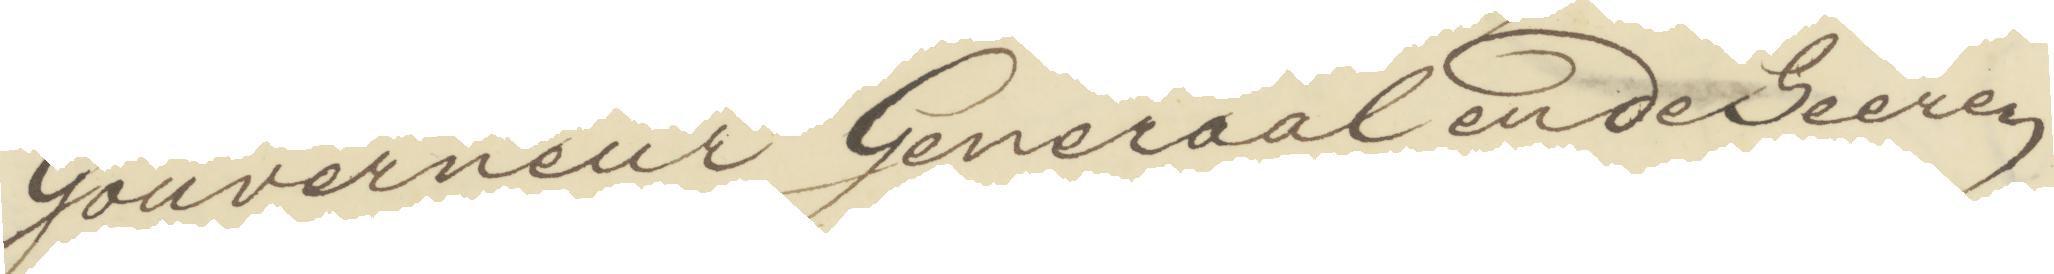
Gouverneur Generaal en de heeren
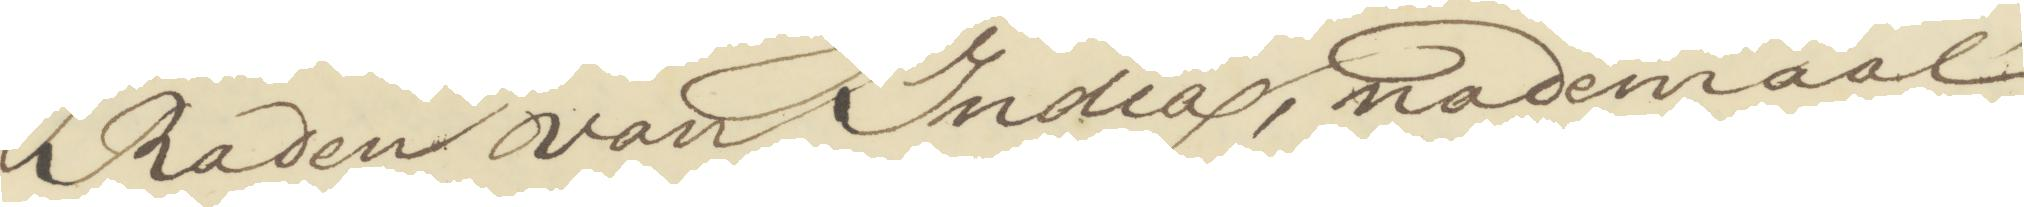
Raden van India, nademaal
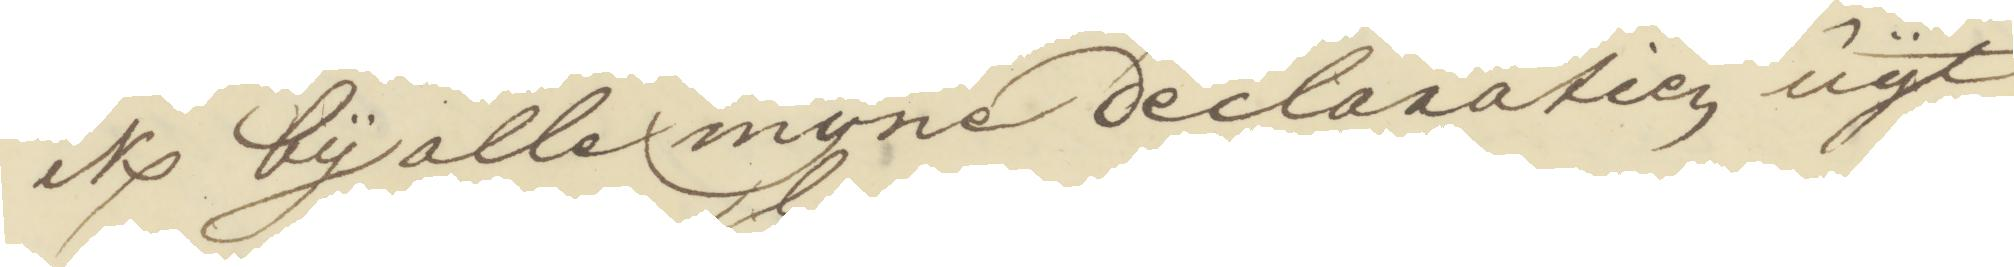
ik bij alle mijne declaratien uijt
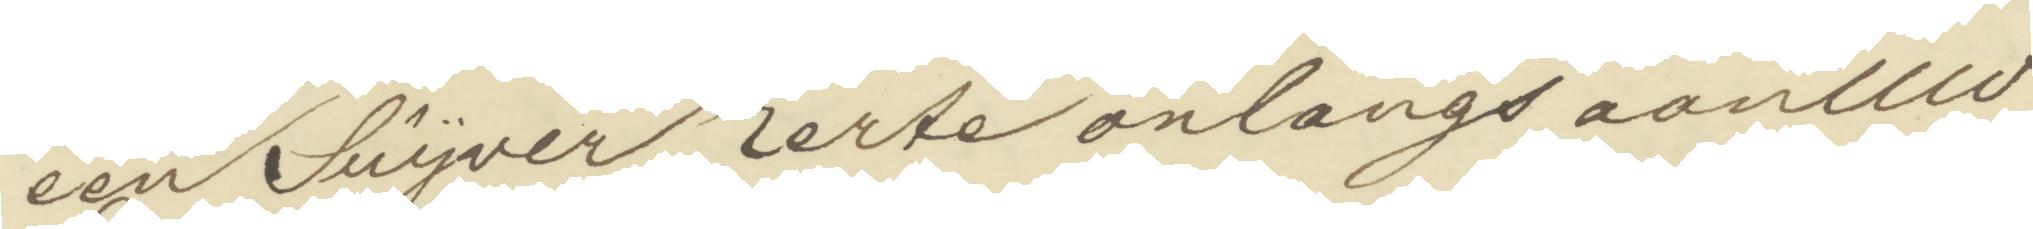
een suijver herte onlangs aan uw
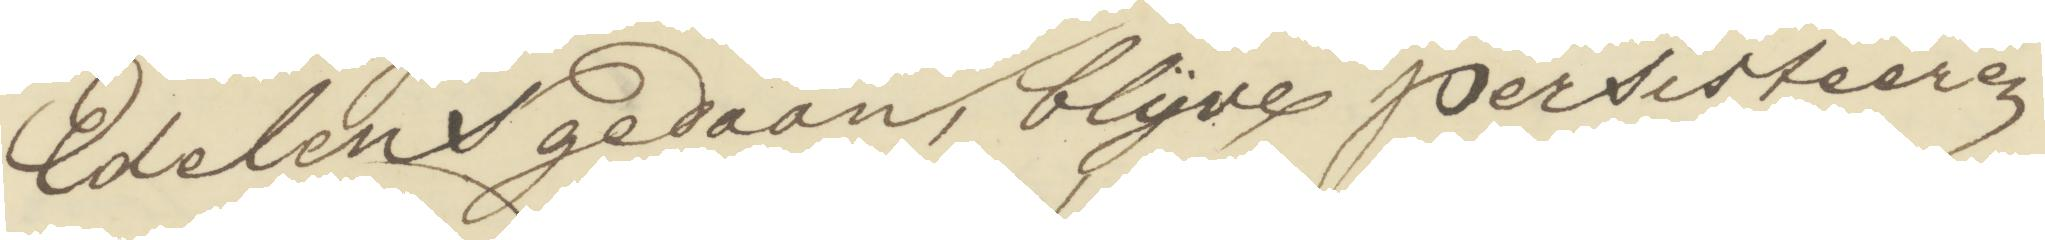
Edelens gedaan, blijve persisteeren
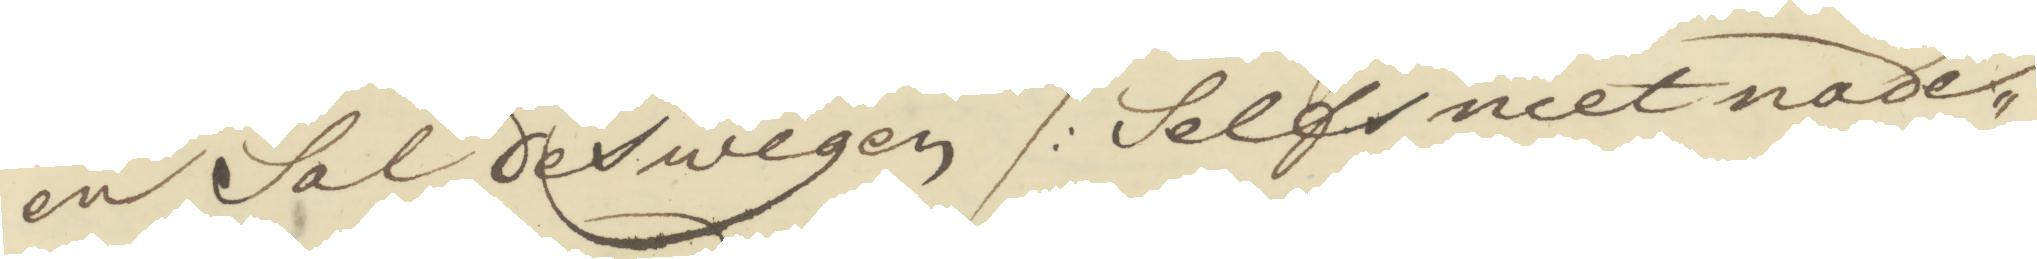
en sal deswegen /:selfs niet nade„
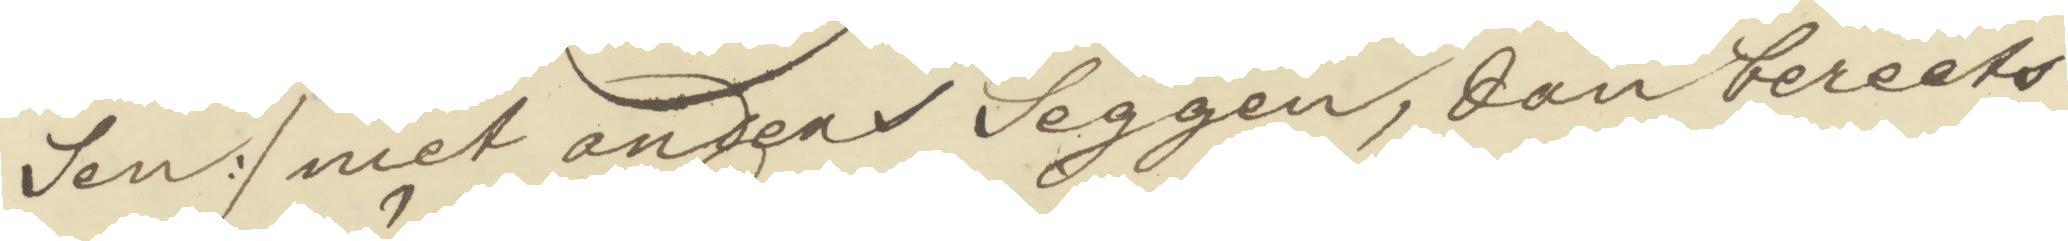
sen:/ niet anders seggen, dan bereets
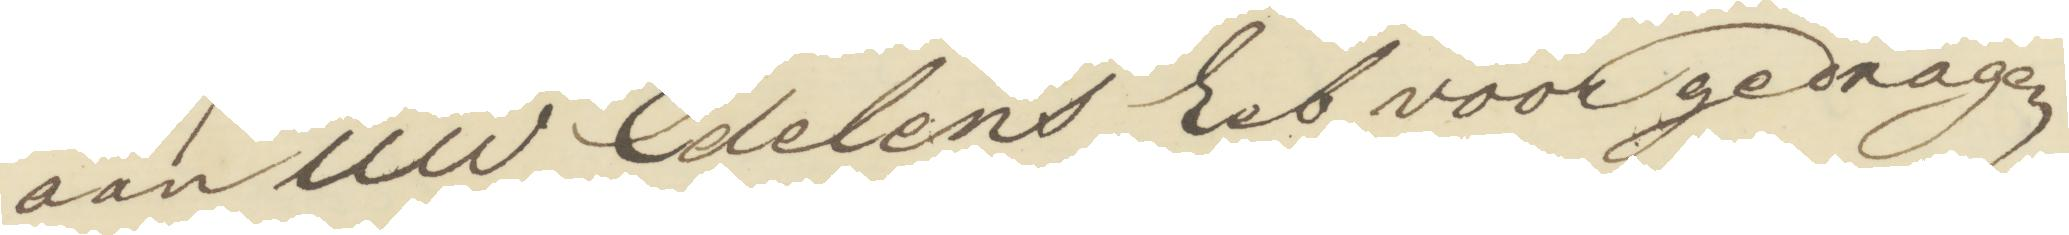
aan uw Edelens heb voor gedragen
